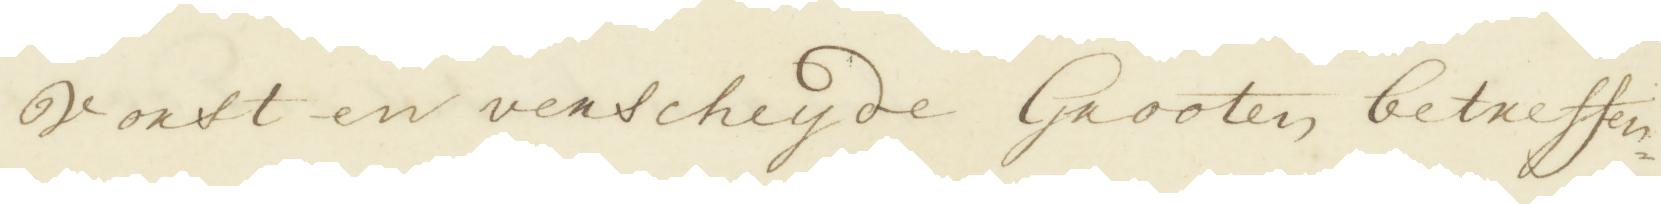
vorst en verscheyde Grooten betreffen
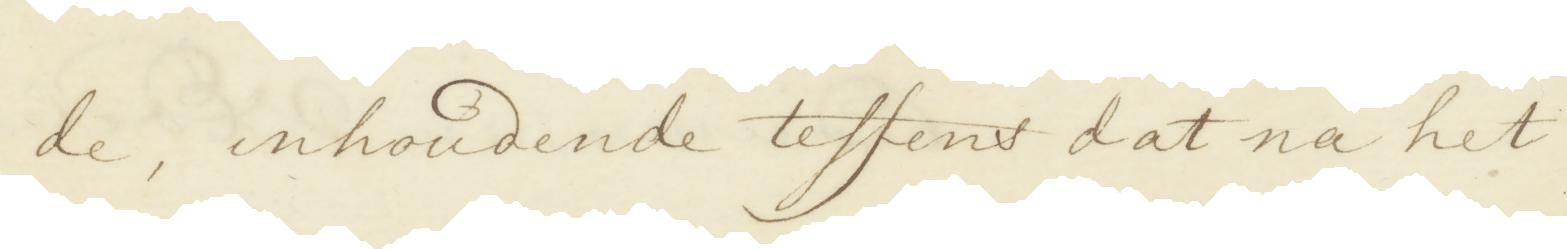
de, inhoudende teffens dat na het
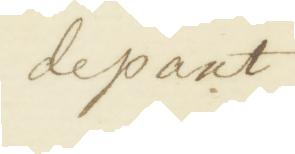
depart
